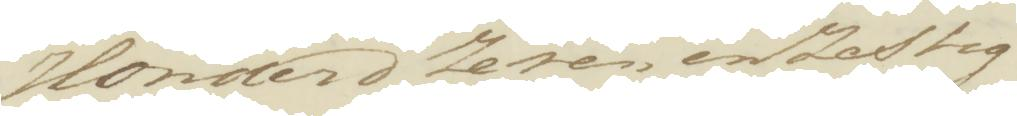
Honderd Zeven en Zestig
